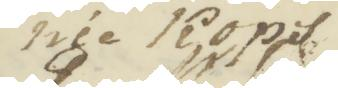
née Kops
